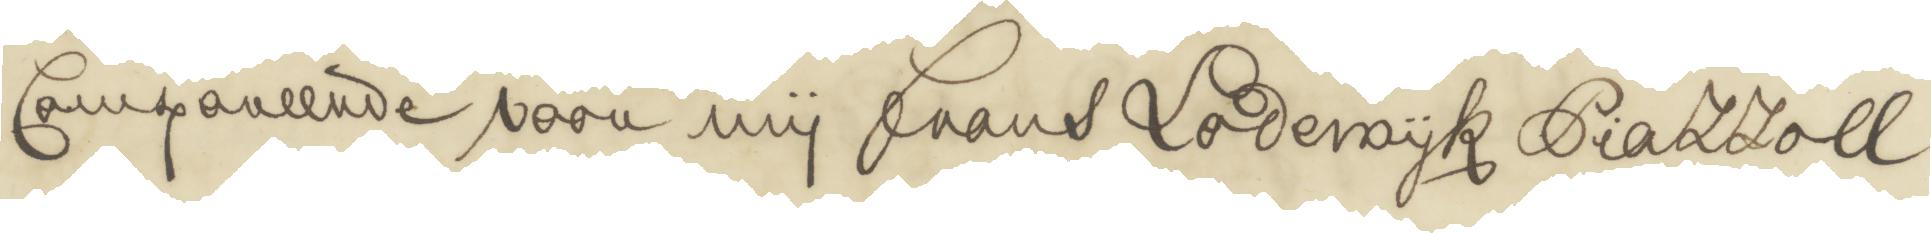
Compareerde voor mij Frans Lodewijk Piazzoll
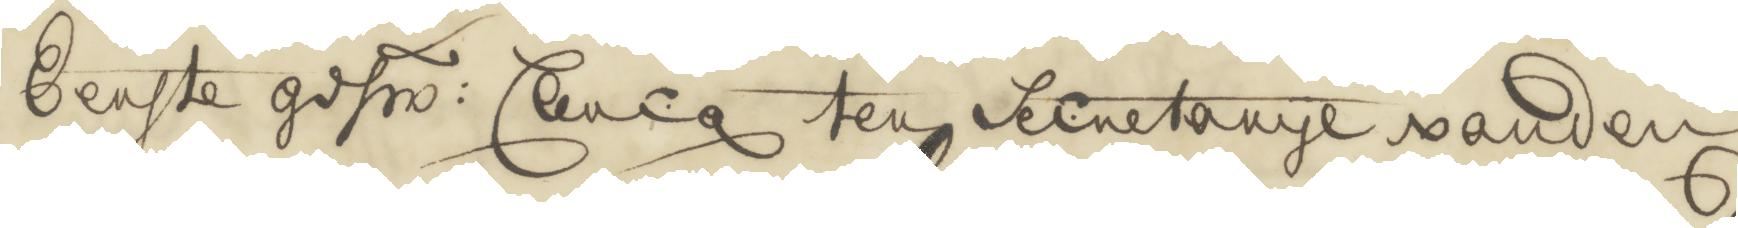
Eerste gesw: Clercq ter Secretarije vanden
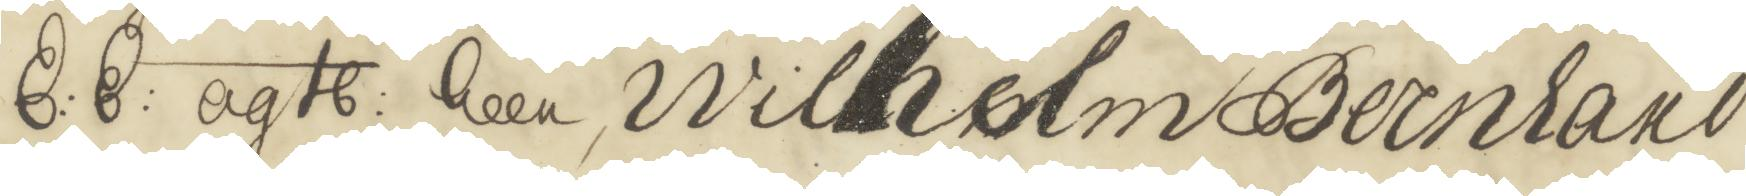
E: E: agtb: heer, Wilhelm Bernhard
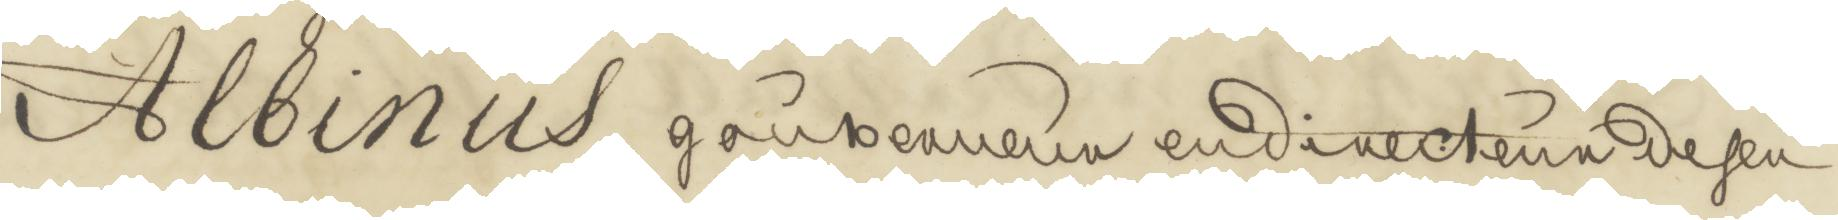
Albinus, gouverneur en directeur deser
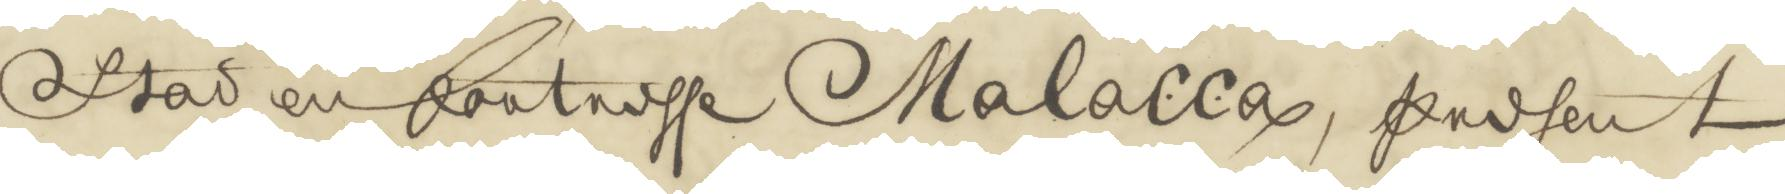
Stad en fortresse Malacca, present
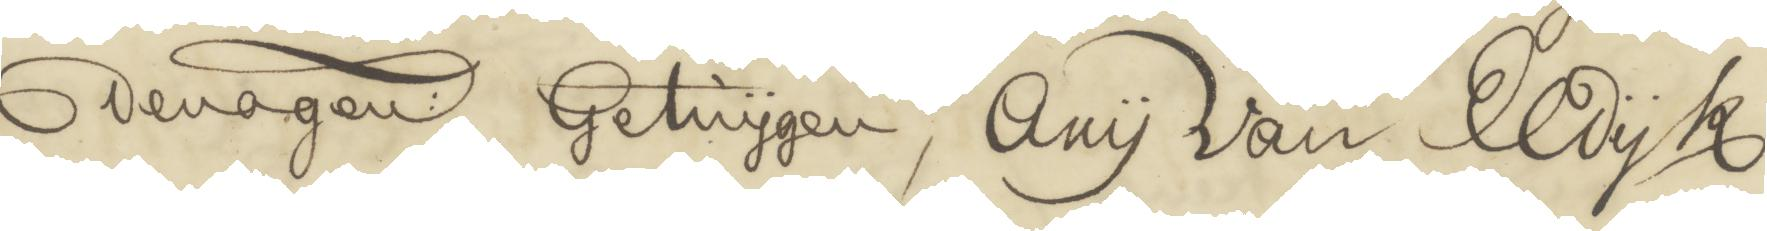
de nagen: Getuijgen, Arij van Eldijk
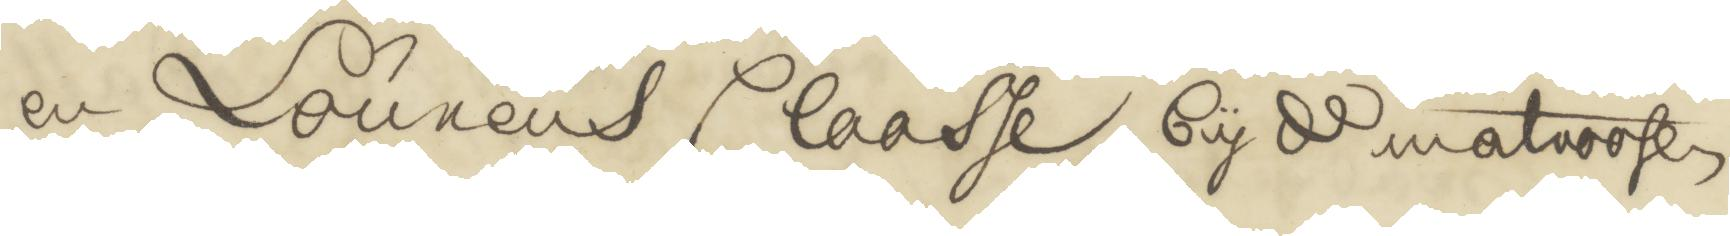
en Lourens Claasse, bij de matroosen
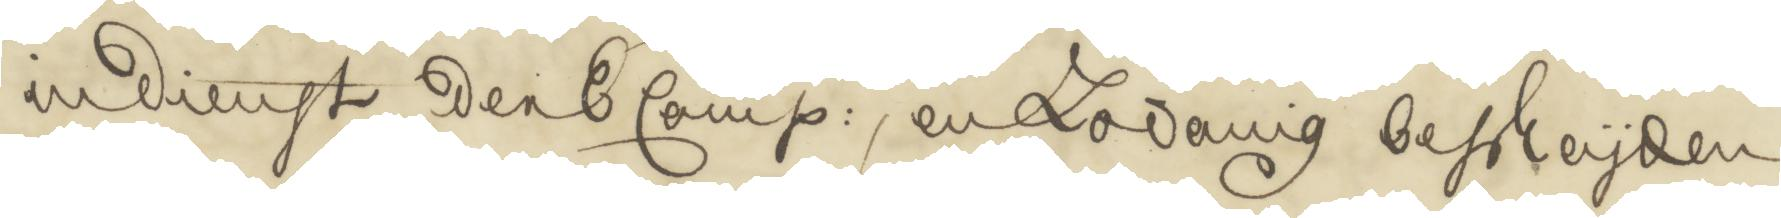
in dienst der E Comp:, en zodanig bescheijden
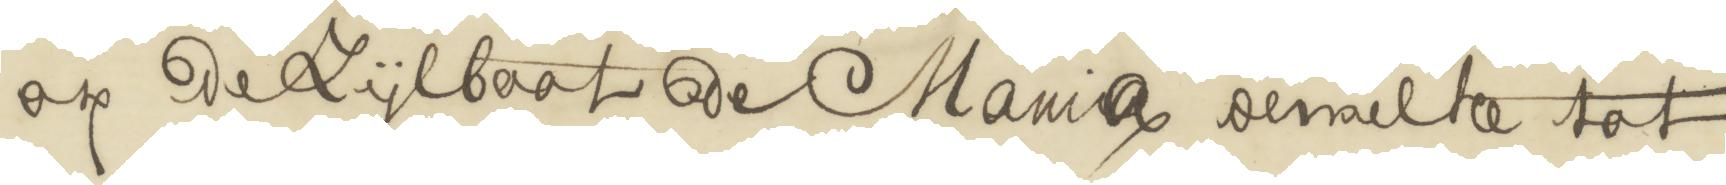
op de zijlboot de Maria dewelke tot
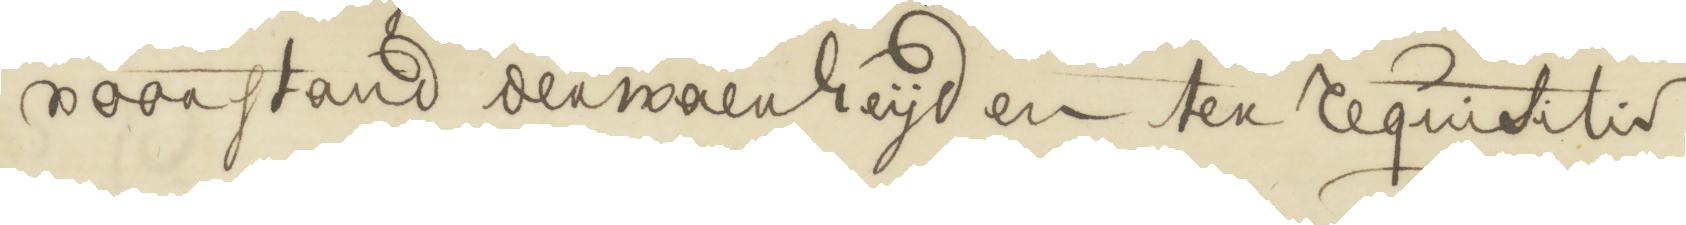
voorstand der waerheijd en ter requisitie
